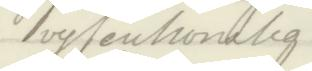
vyf entwintig
